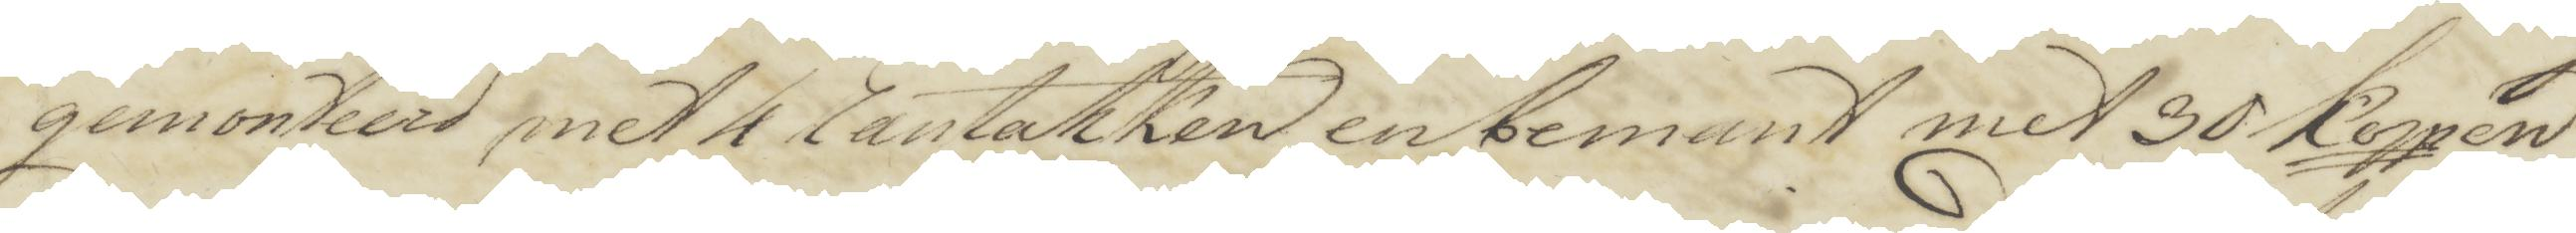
gemonteerd met 4 rantakken en bemant met 30 koppen
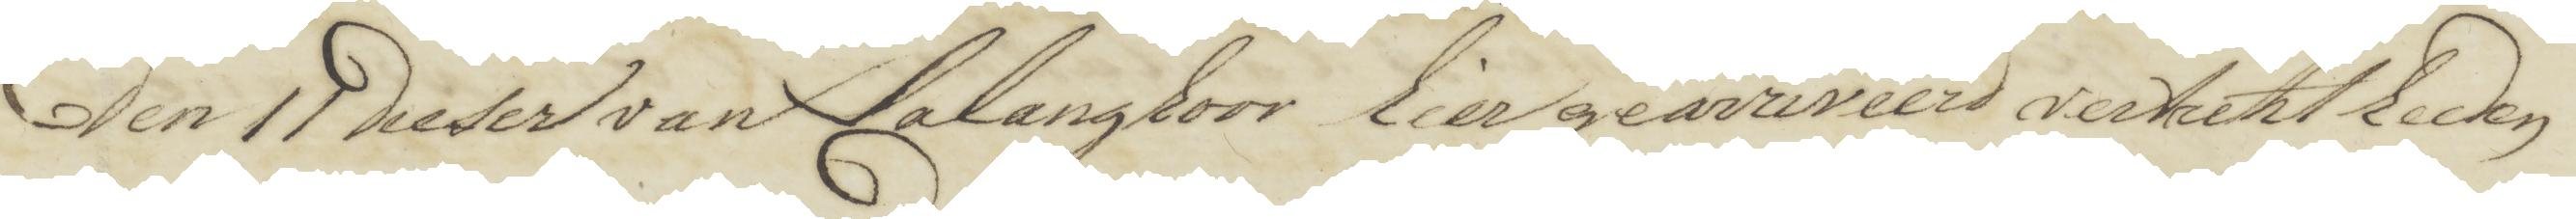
den 11 deeser van salanghoor hier gearriveerd vertrekt heeden
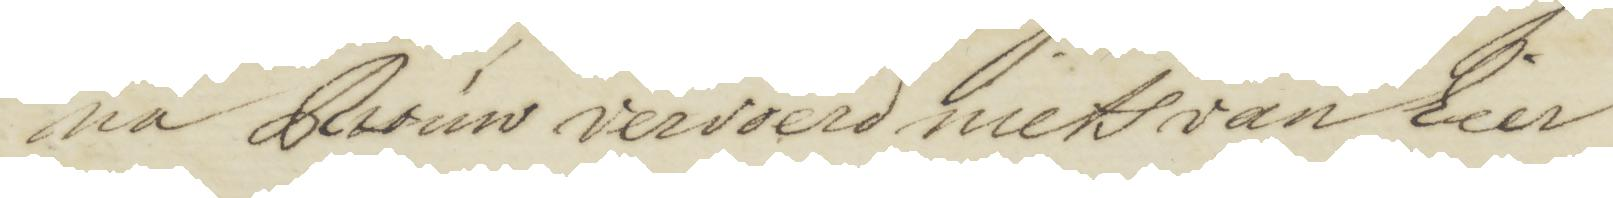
na Riouw vervoerd niets van hier
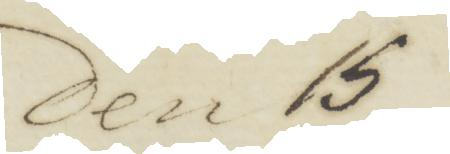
den 15
